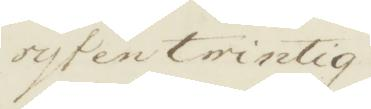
vyf en twintig
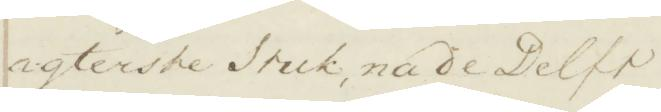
agterste stuk, na de Delft
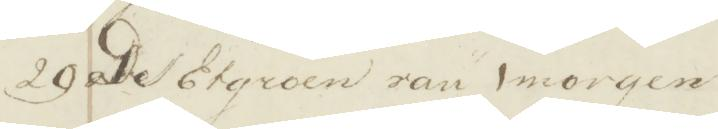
29 De Etgroen van 1 morgen
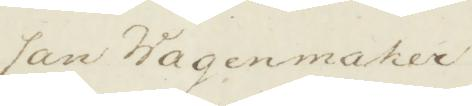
Jan Wagenmaker
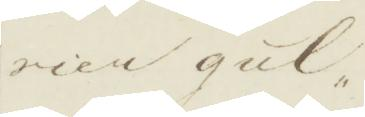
vier gul„
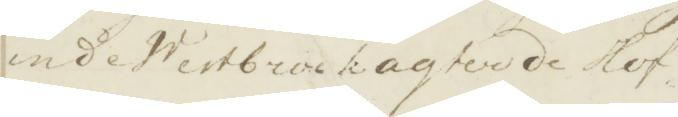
in de Westbroek agter de Hof„
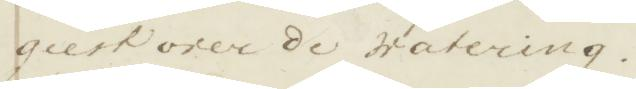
geest over de watering.
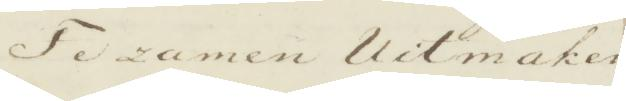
Te zamen Uitmakende
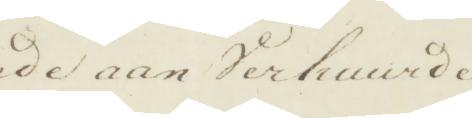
aan Verhuurde
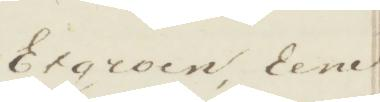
Etgroen, Eene
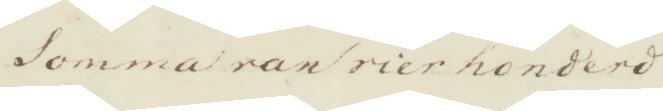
somma van vierhonderd
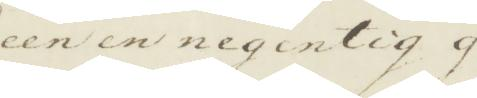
een en negentig g
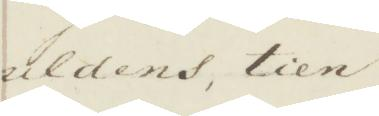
uldens, tien
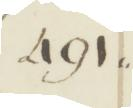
491„
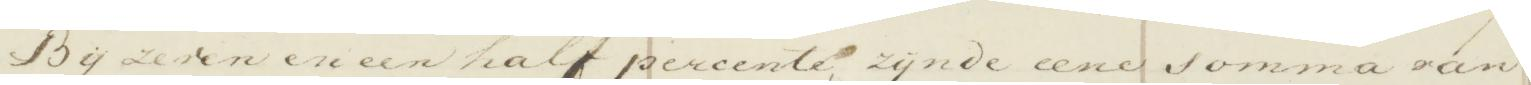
Bij zeven en een half percente, zijnde eene somma van
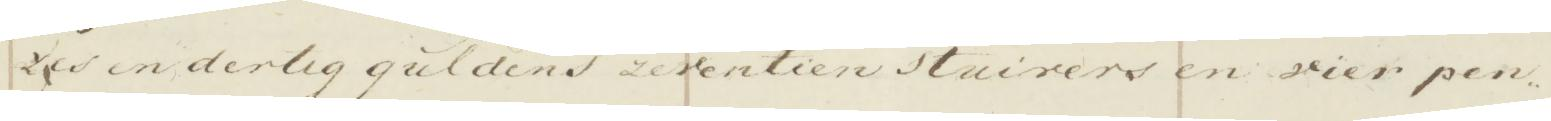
zes en dertig guldens zeventien stuivers en vier pen„
